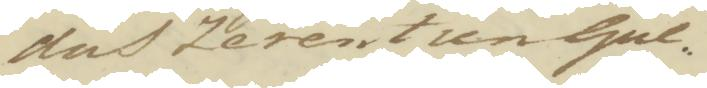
dus Zeventien Gul„
